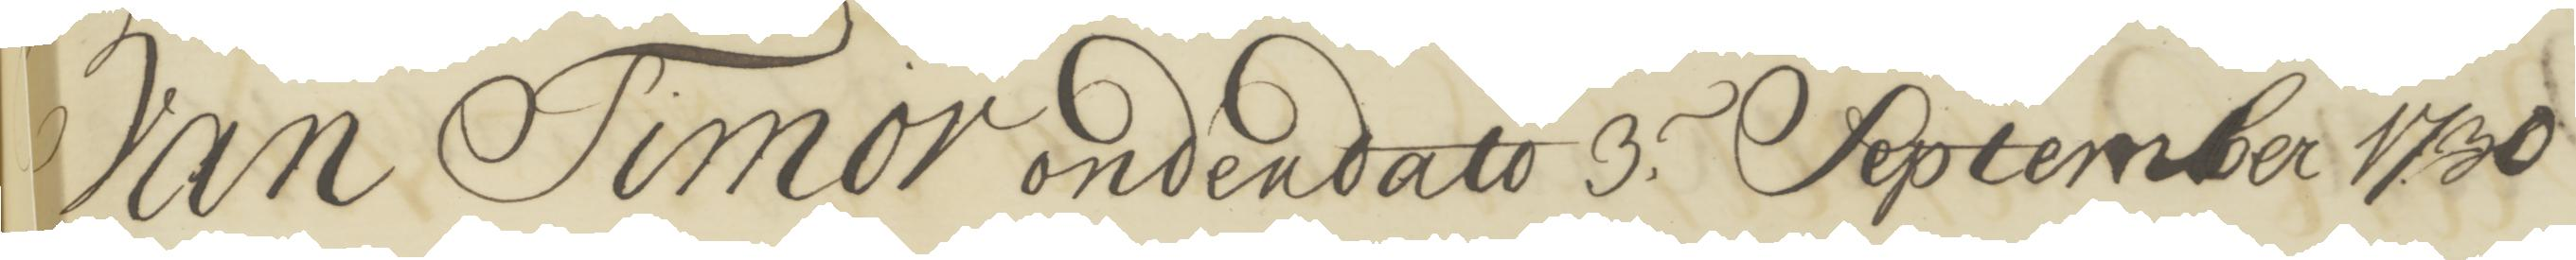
Van Timor onderdato 3:' September 1730
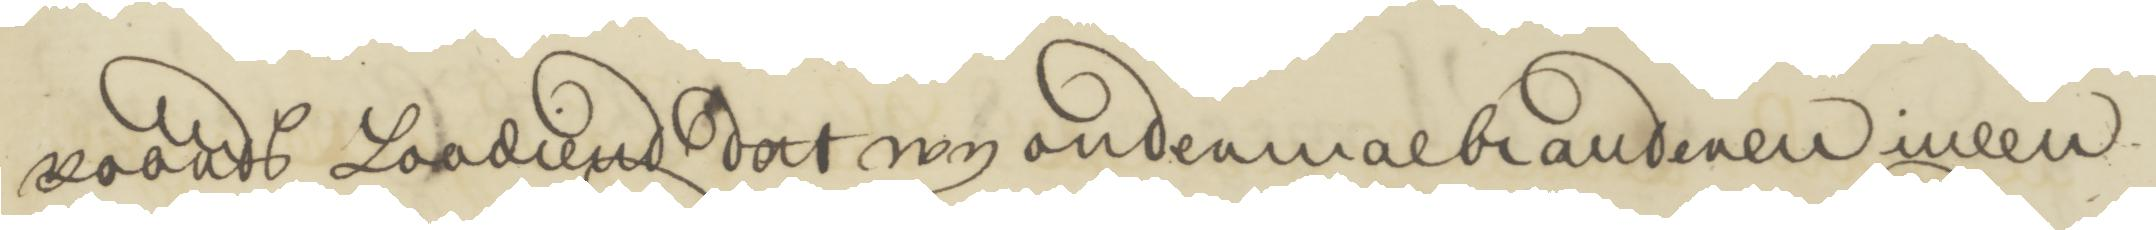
voords zoodiend dat wy ondermalkanderen ineen
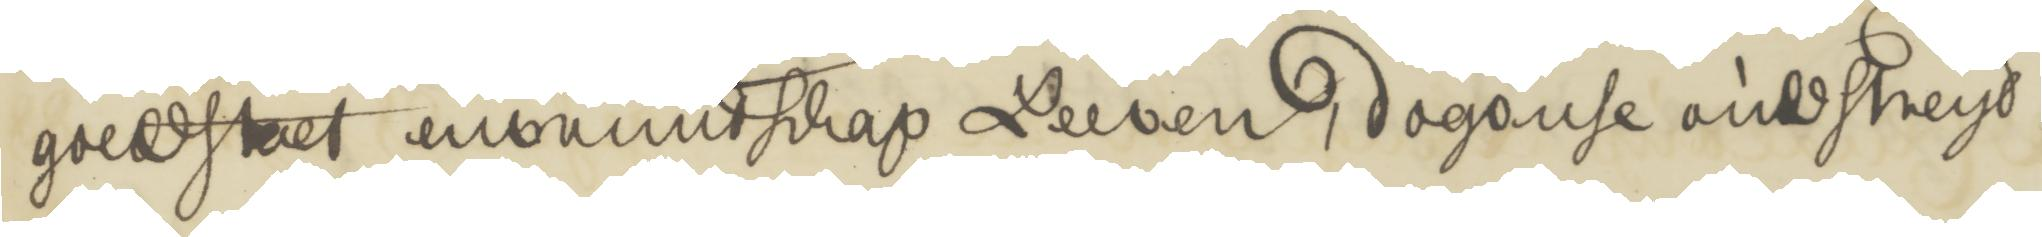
goedestaet envrundschap leeven, dogonse oude streyd
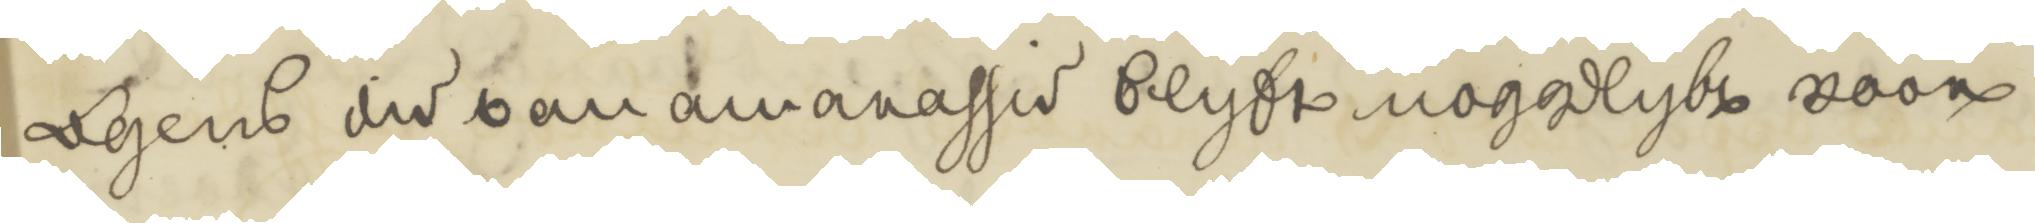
tegens die van amarassie blyft noggelyk voor
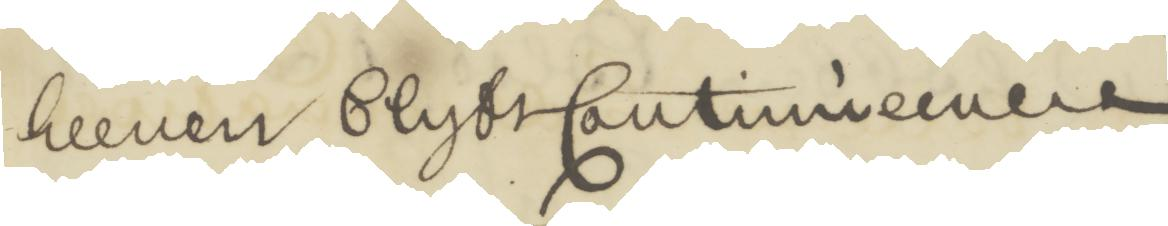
heenen blyftcontinueeren
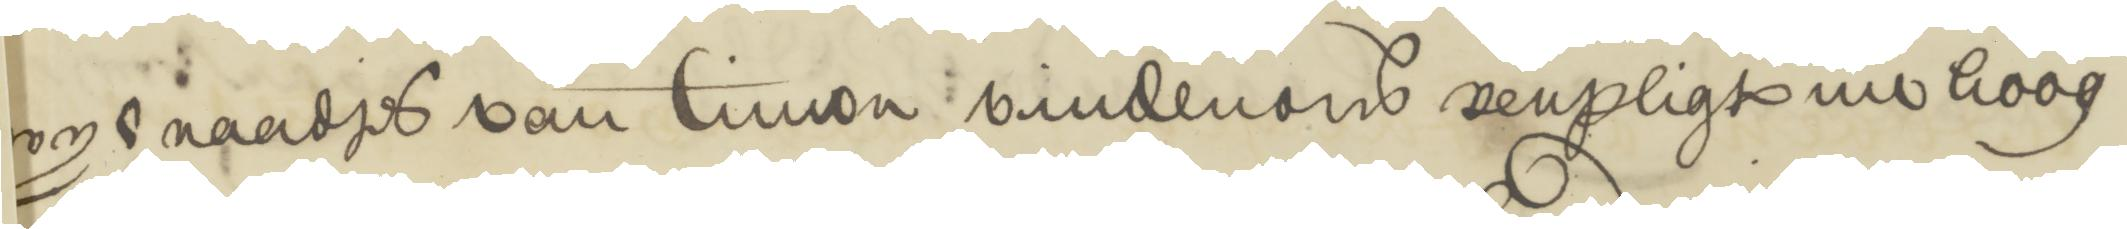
wy 5 raadjes van timor vinden ons verpligt uw hoog
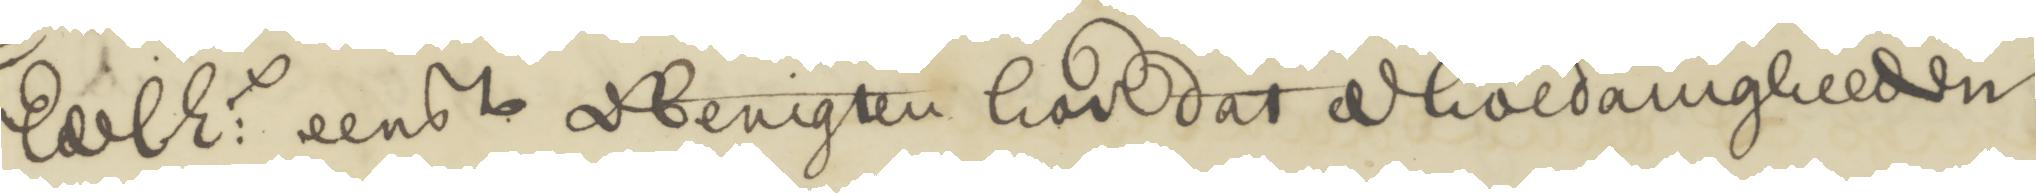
Edelh:s eenst teberigten hoe dat dehoedanigheeden
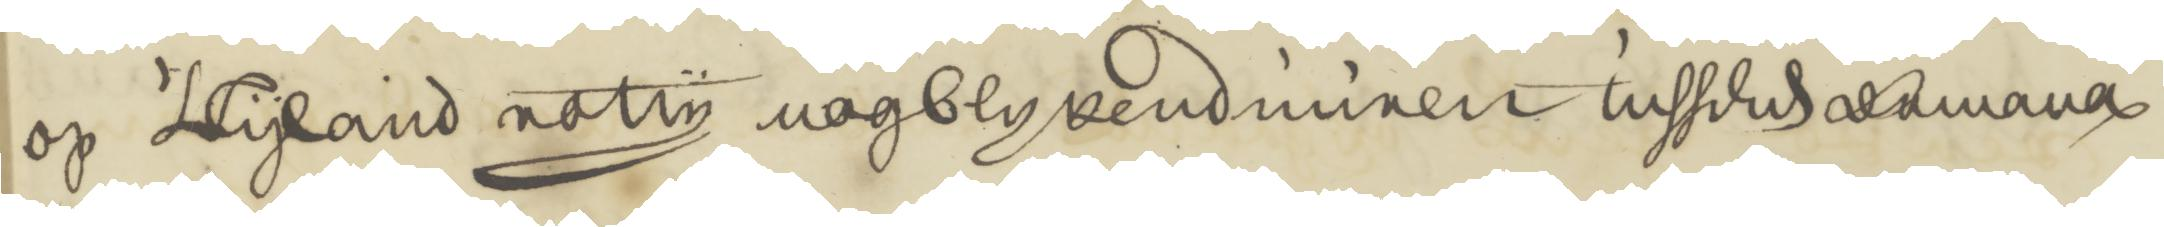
op 'tEijland rottij nogblyvenduuren tusschen ermana
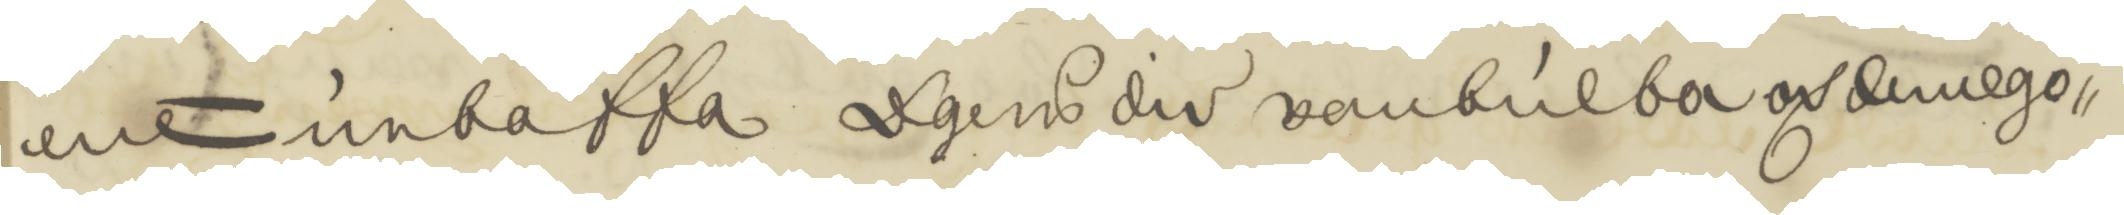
encurbaffa tegens die vanbulba over denego„
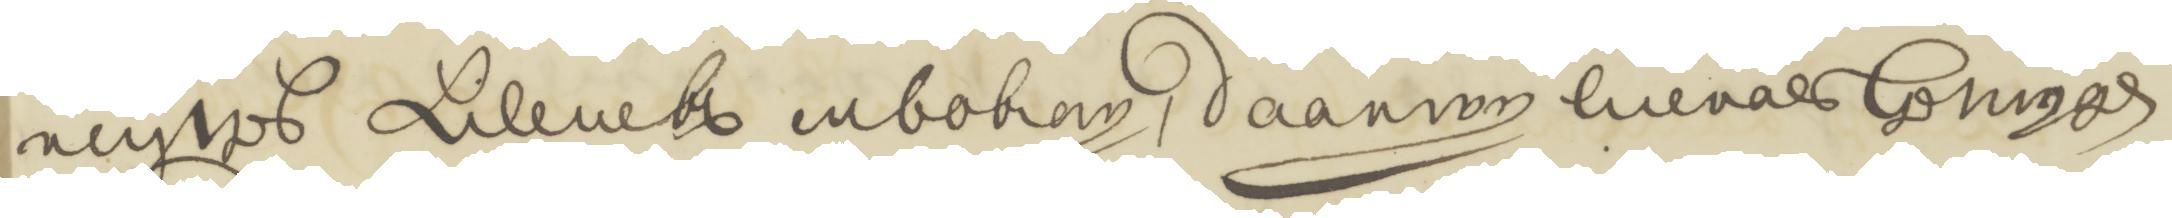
reijtjes Lilenek enbokay, daarwy hieralsGetuygen
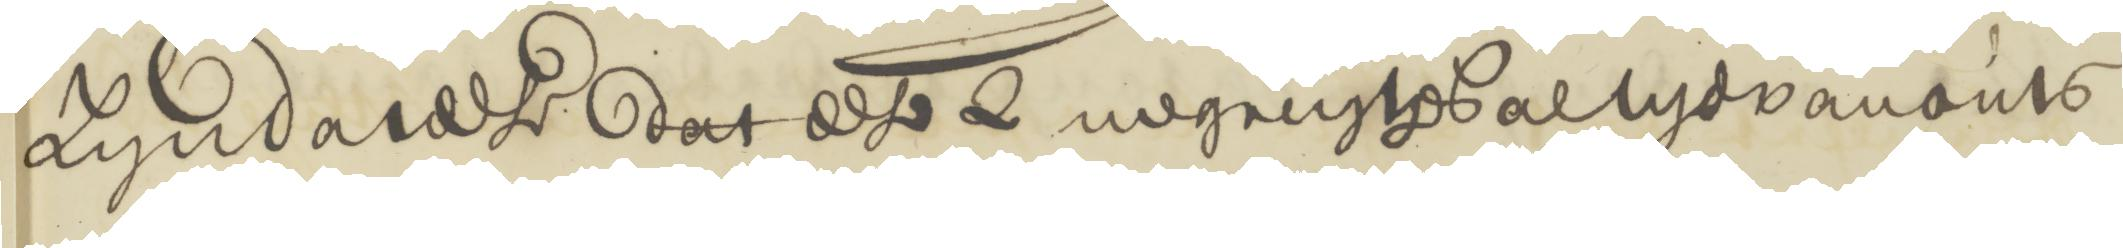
zyndatdese dat dese 2 negreytjes altijdvanouts
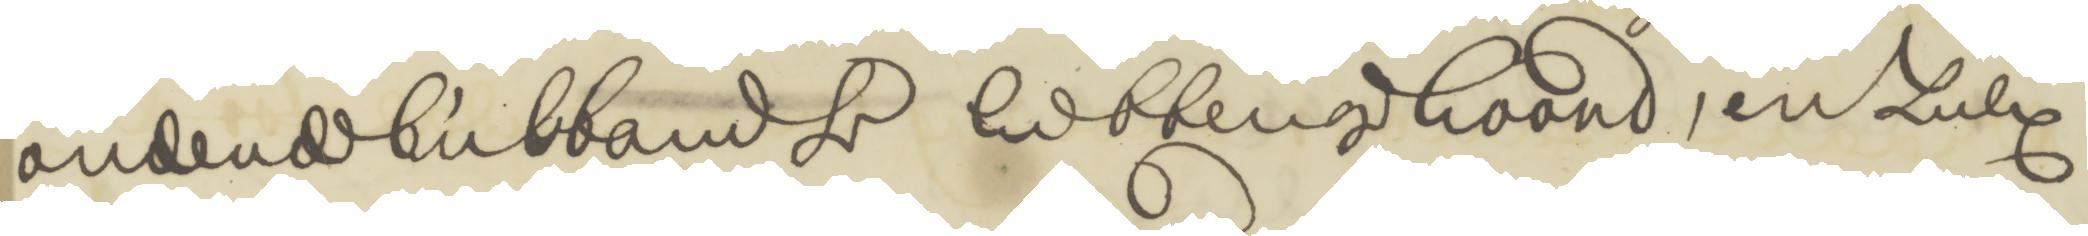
onderdebulbanese hebbengehoord, en zulx
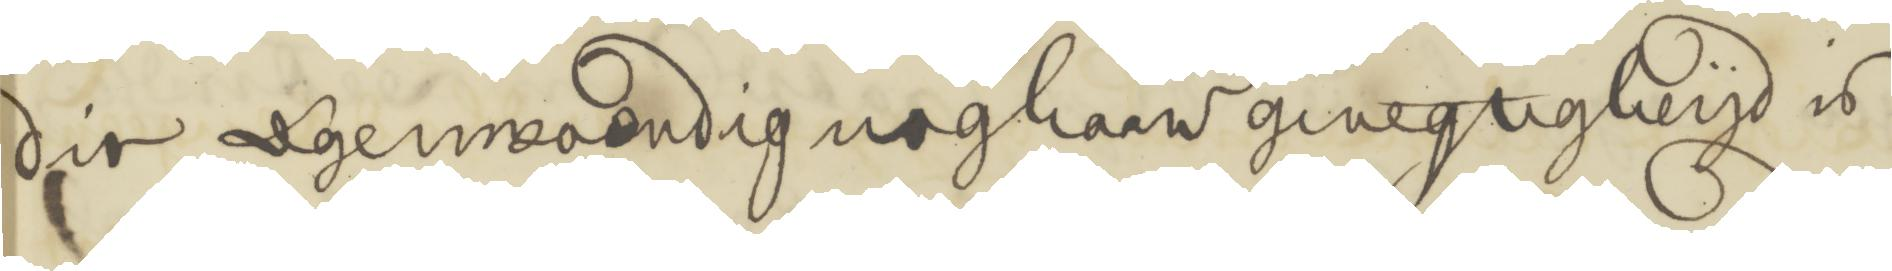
dit tegenwoordig noghaar geregtigheijd is
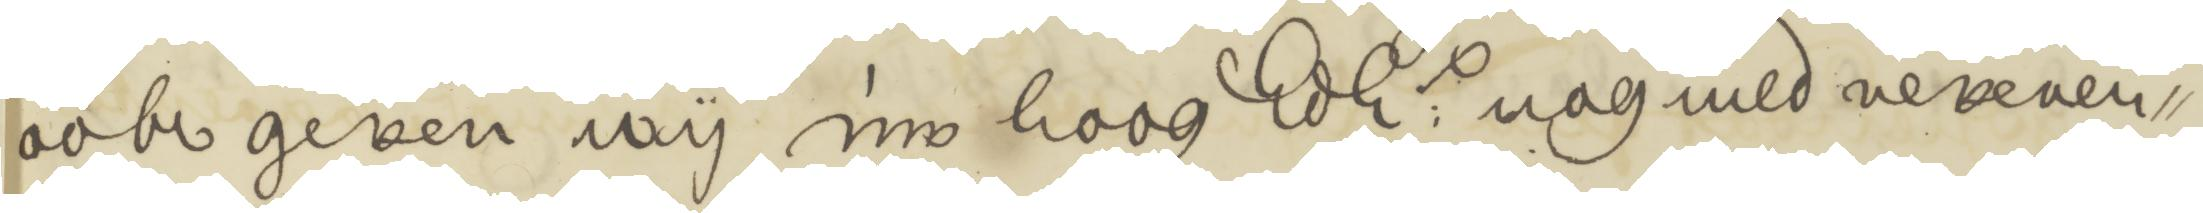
ook geven wij uw hoog Edh:s nog med reveren„
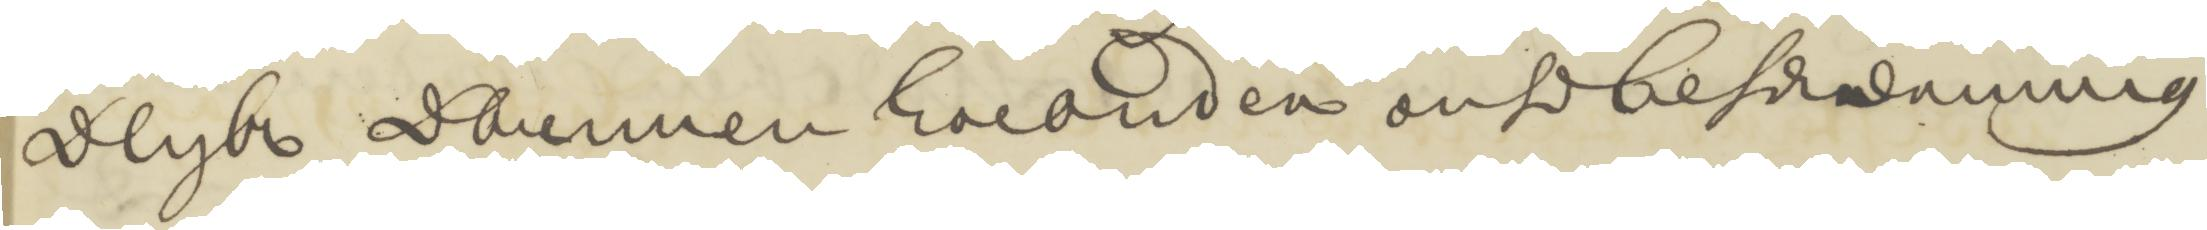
telyk tekennen hoeonder onsebescherming
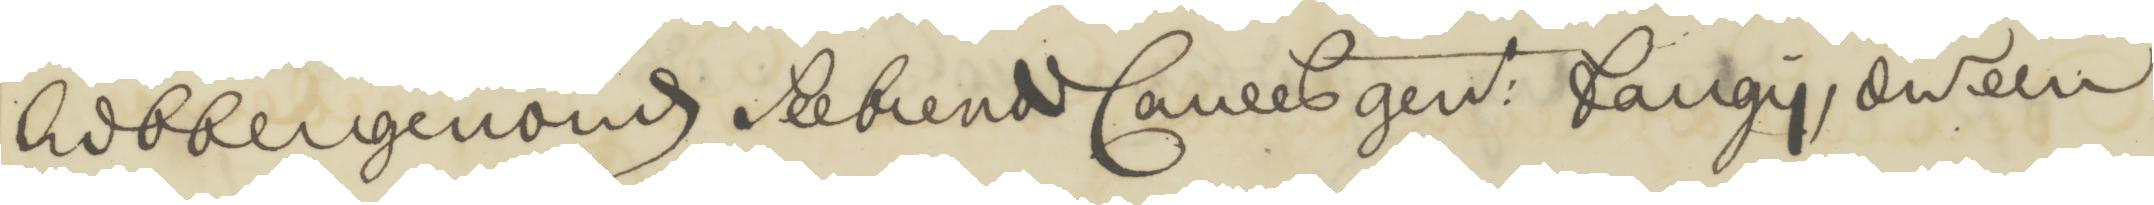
hebbengenomen seekere Canees gen: fangij, die een
